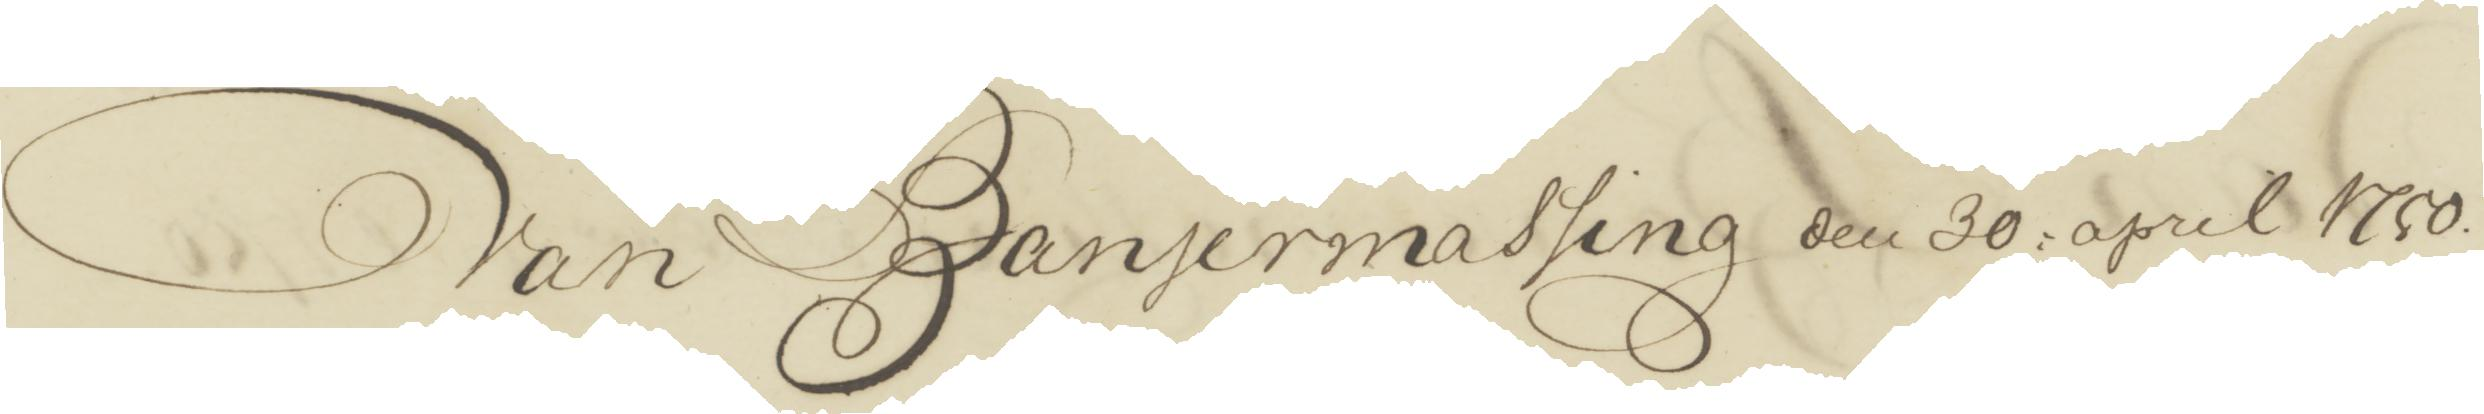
Van Banjermassing den 30: april 1750.
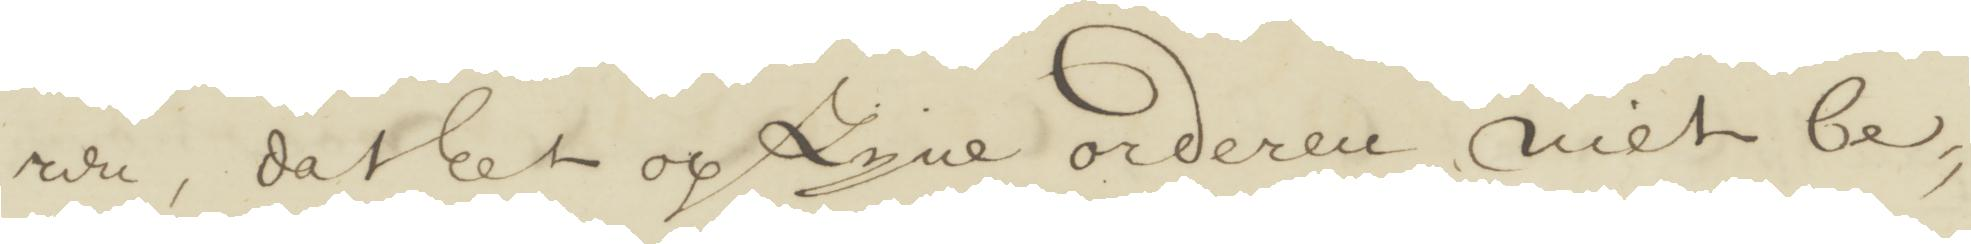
ren, dat het op zijne orderen niet be„
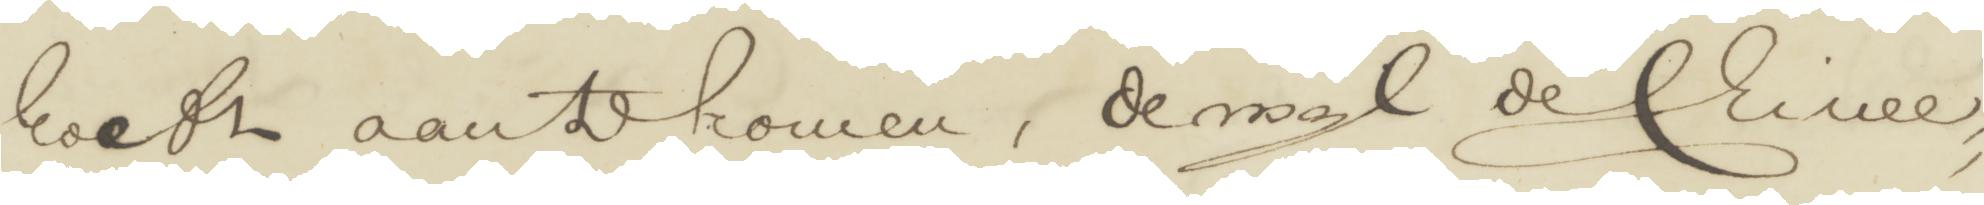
hoeft aan te komen, dewijl de Chinee„
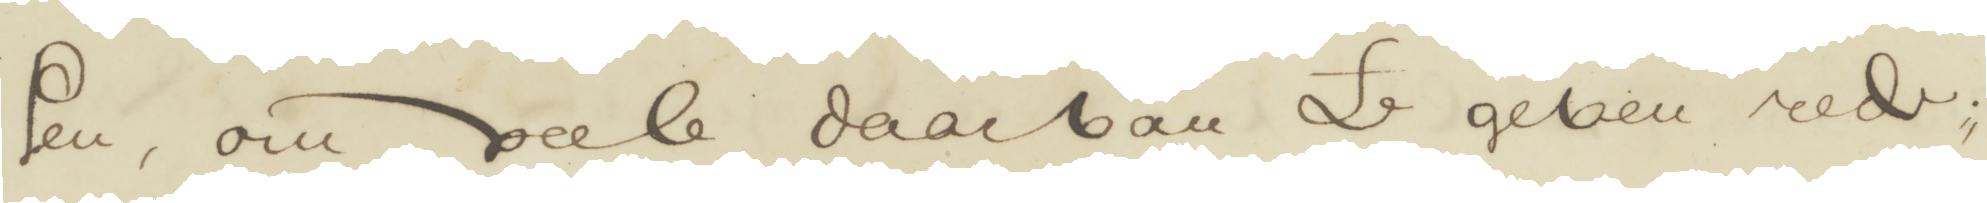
sen, om veele daarvan te geven rede„
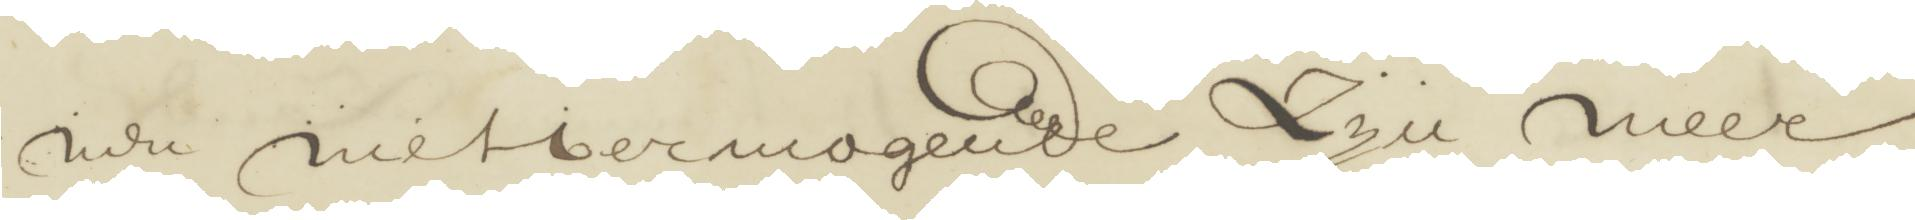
nen niet vermogende zijn meer
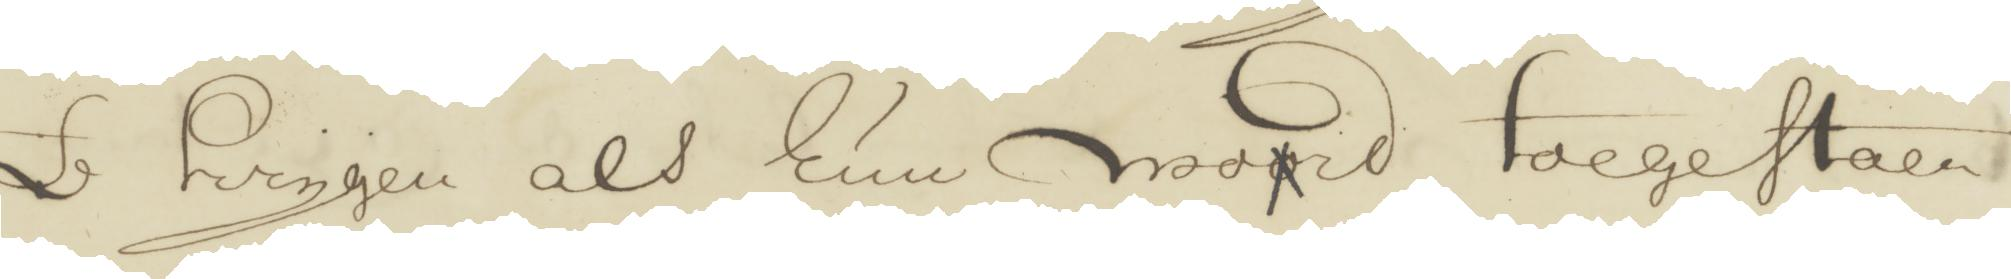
te krijgen als hun woord toegestaen
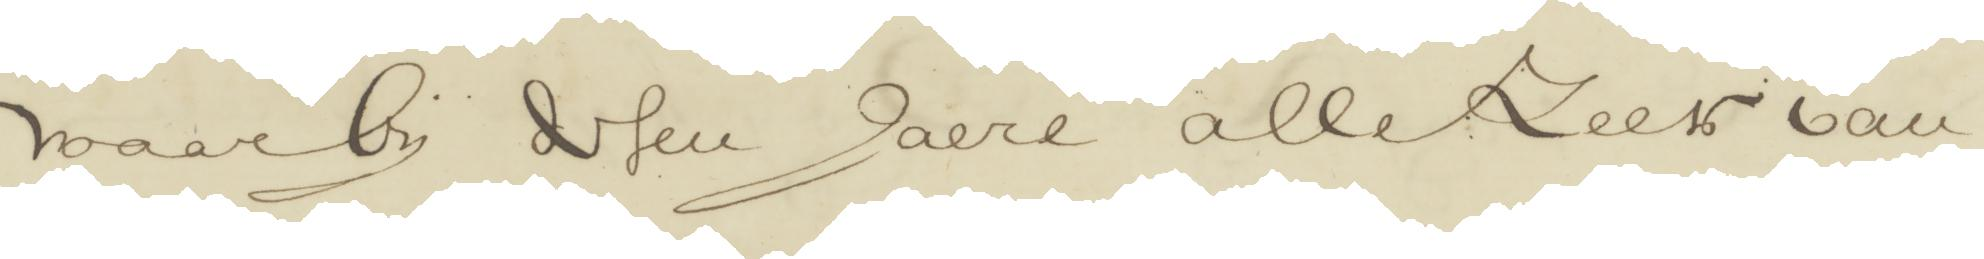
waarbij desen Jaere alle zeer van
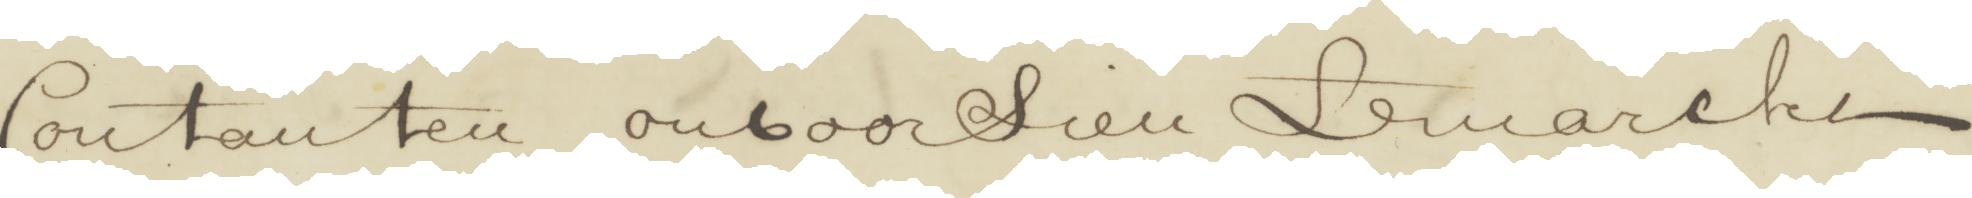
Contanten onvoorsien temarckt
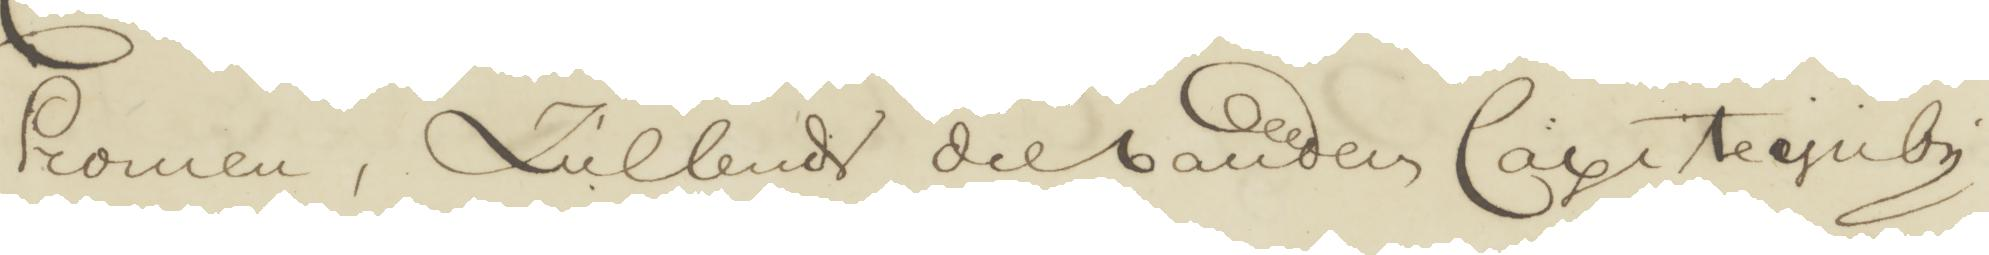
komen, zullende die van den Capiteijn bij
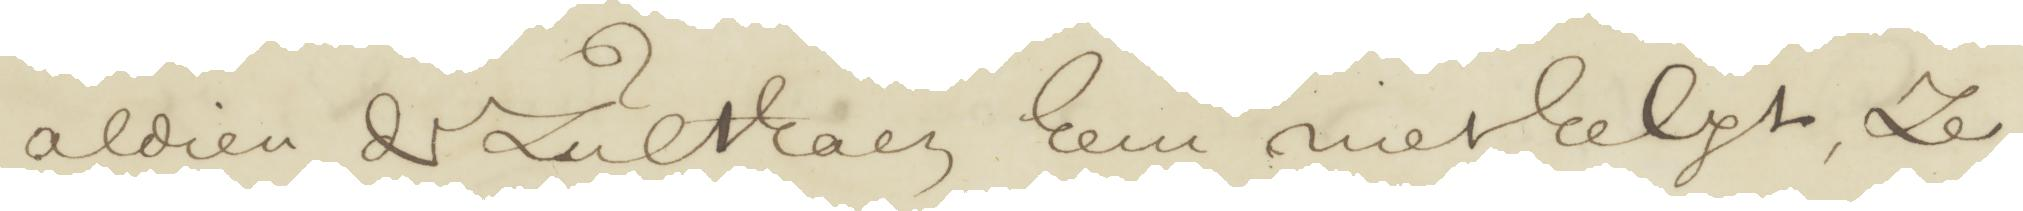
aldien de zulthaen hem niet helpt, ze
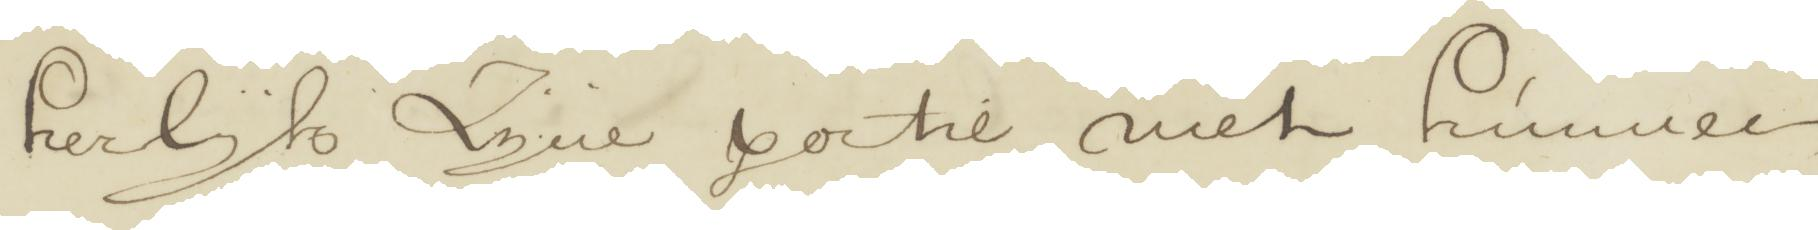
kerlijk zijne portie niet kunnen
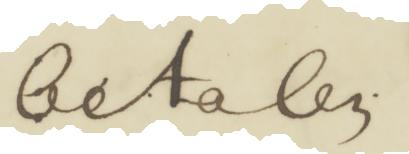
betalen.
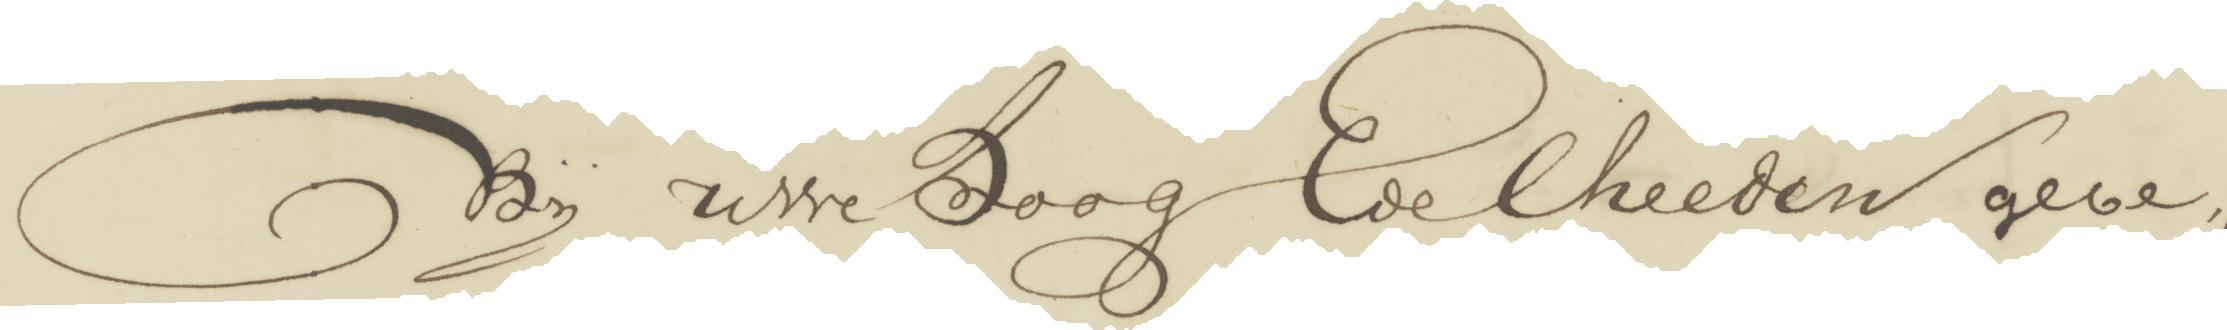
Bij uwe Hoog Edelheeden geve„
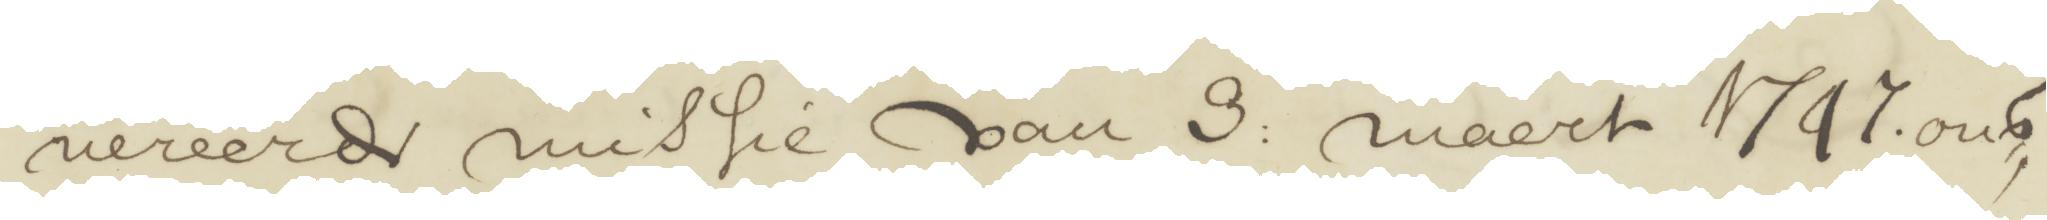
nereerde missie van 3: maert 1747. ons„
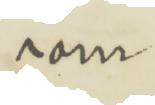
^om
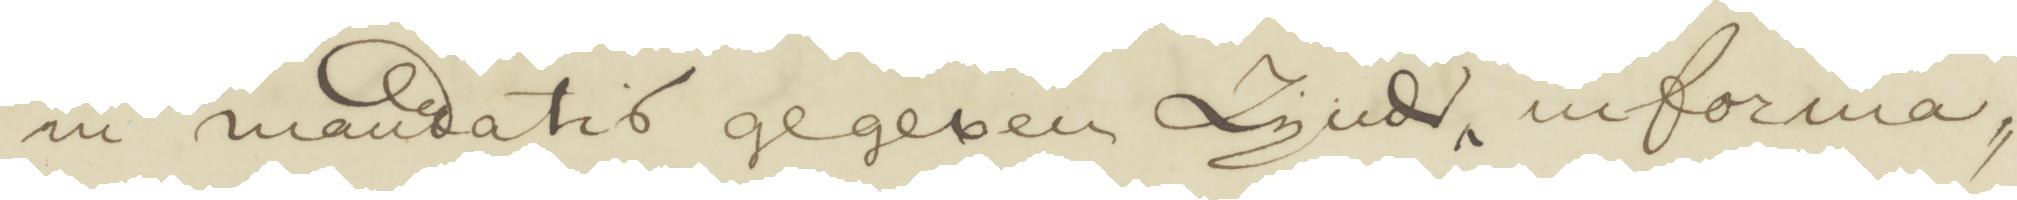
in mandatis gegeven zijnde ^ in forma„
